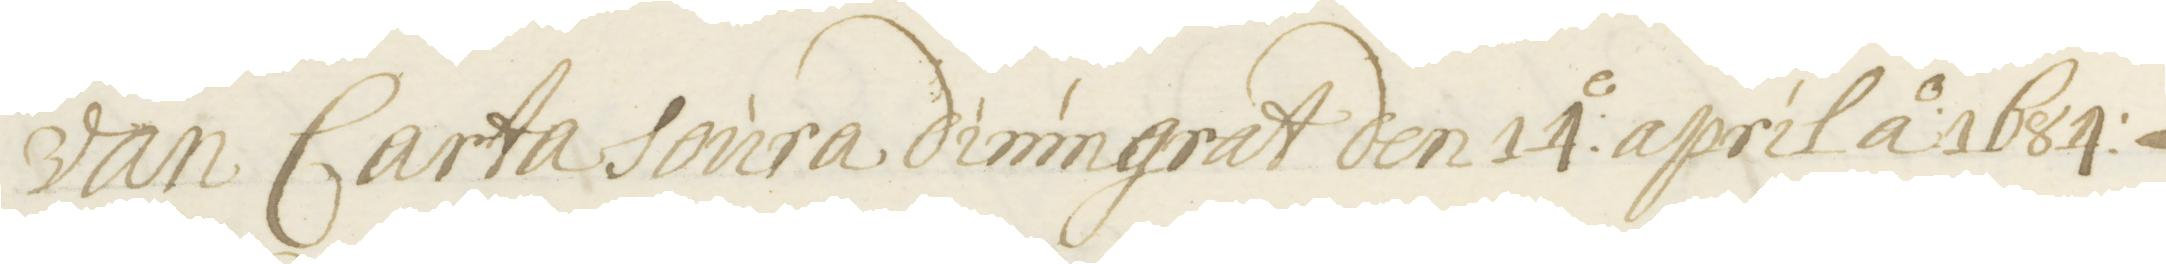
van Carta soura diningrat den 14:e april a:o 1684:
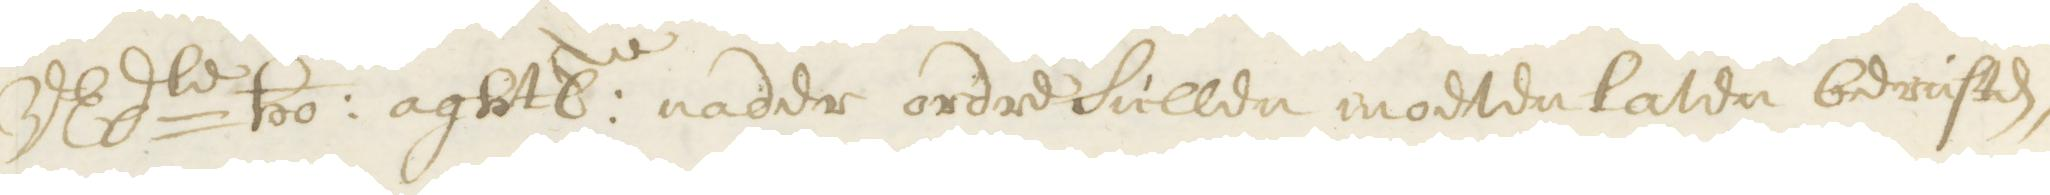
VEd=le ho: aghtb:e nader ordre sullen moeten laten berusten,
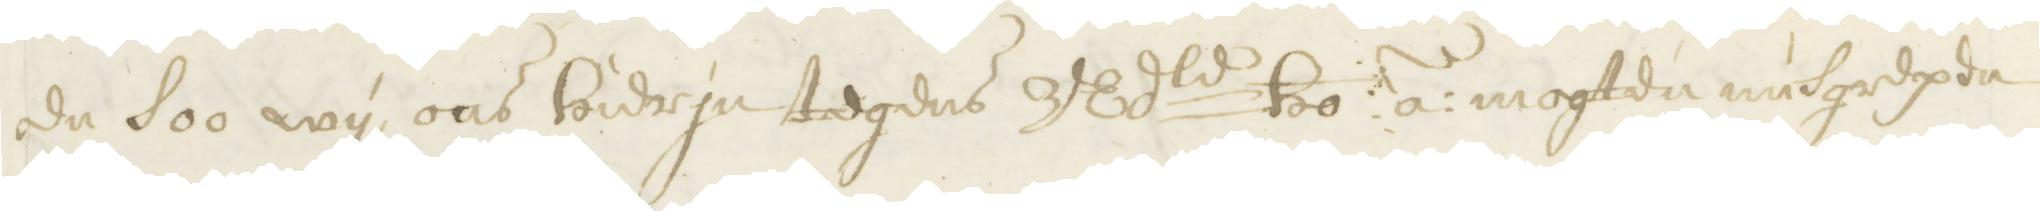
en soo wij ons hierjn tegens VEd=le ho: a:e mogten misgrepen
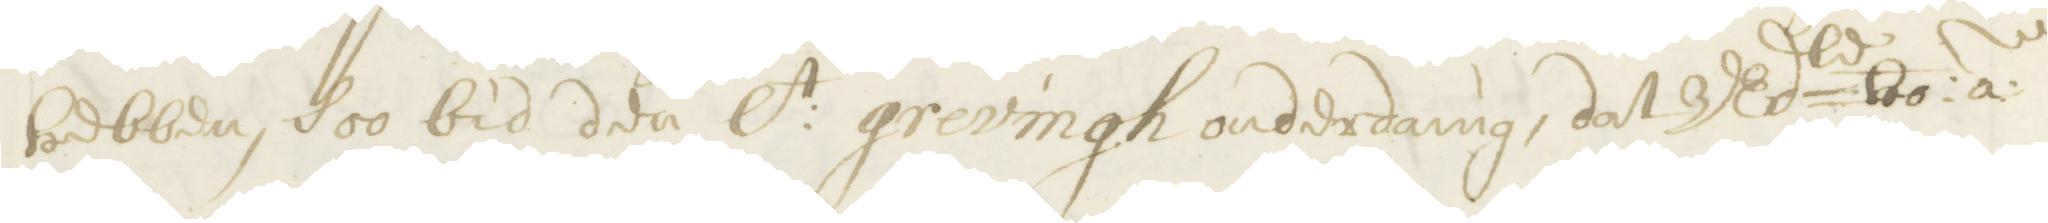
hebben, soo bid den l:t grevingh onderdanig, dat VEd=le ho: a:
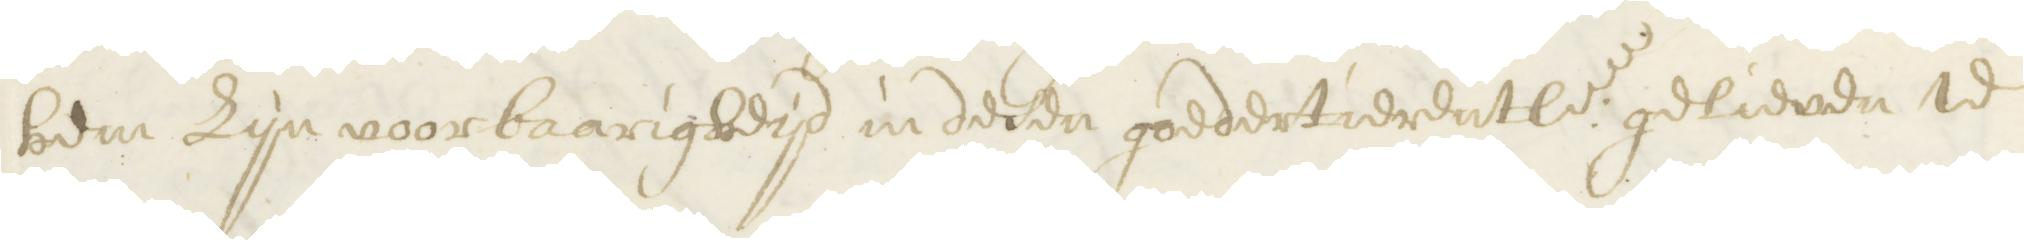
hem zijn voorbaarigheijd in desen goedertierentl: gelieven te
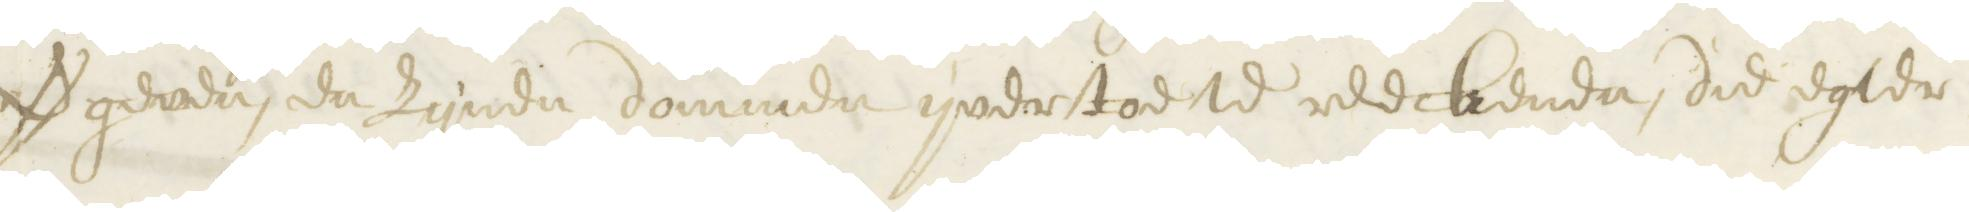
vergeven, en zijnen dommen ijver toe te reeckenen, die egter
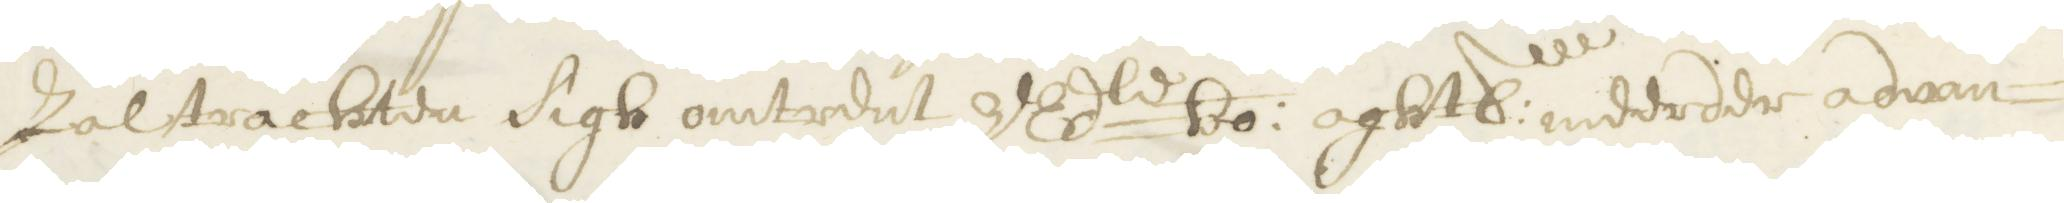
zal trachten sigh omtrent VEd=le ho: aghtb: meerder advan=
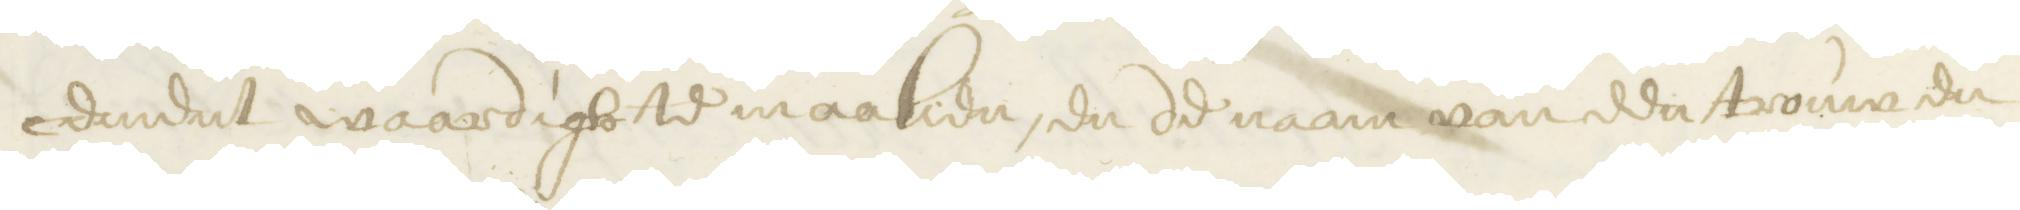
cement waardigh te maaken, en de naam van een trouw en
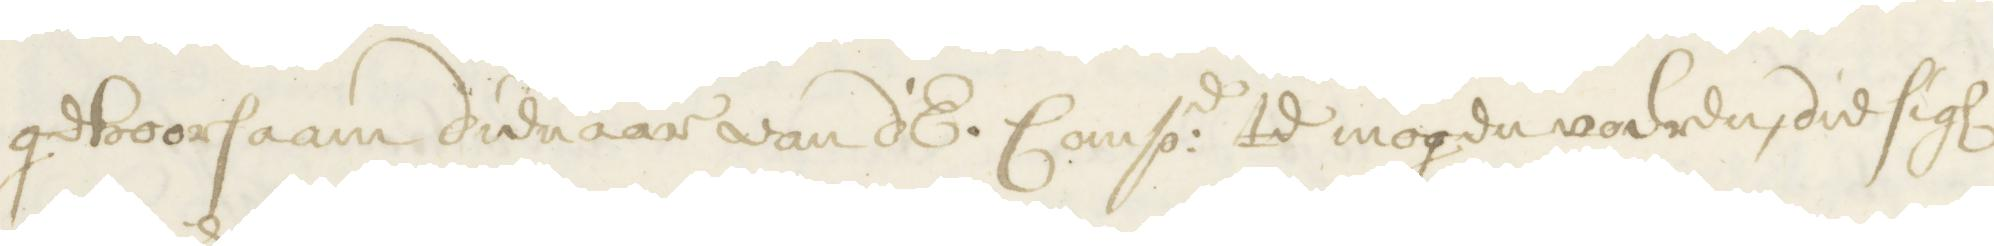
gehoorsaam dienaar van d'E. Comp:e te mogen voeren, die sigh
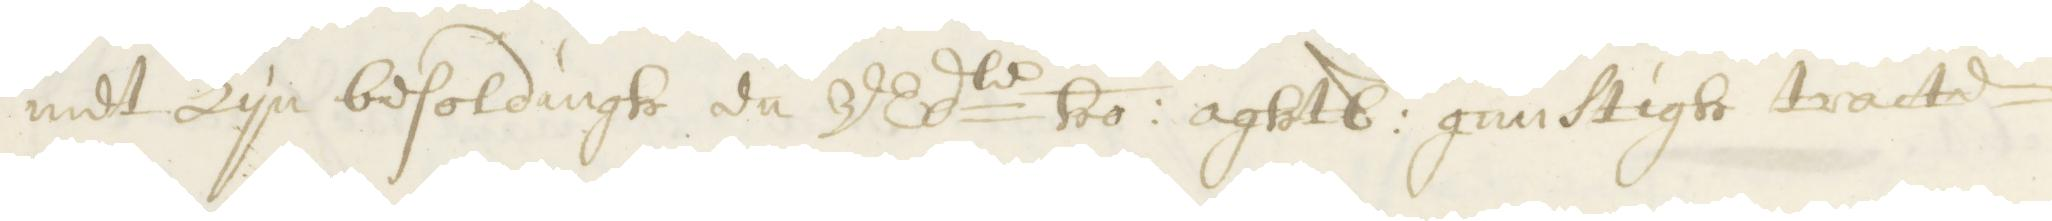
met zijn besoldingh en VEd=le Ho: aghtb: gunstigh tracte
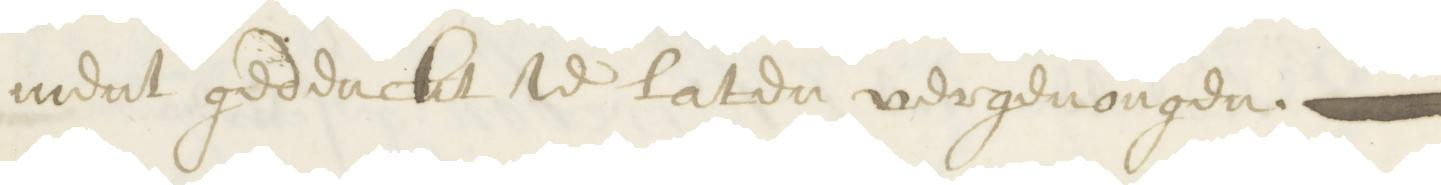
ment gedenckt te laten vergenougen.
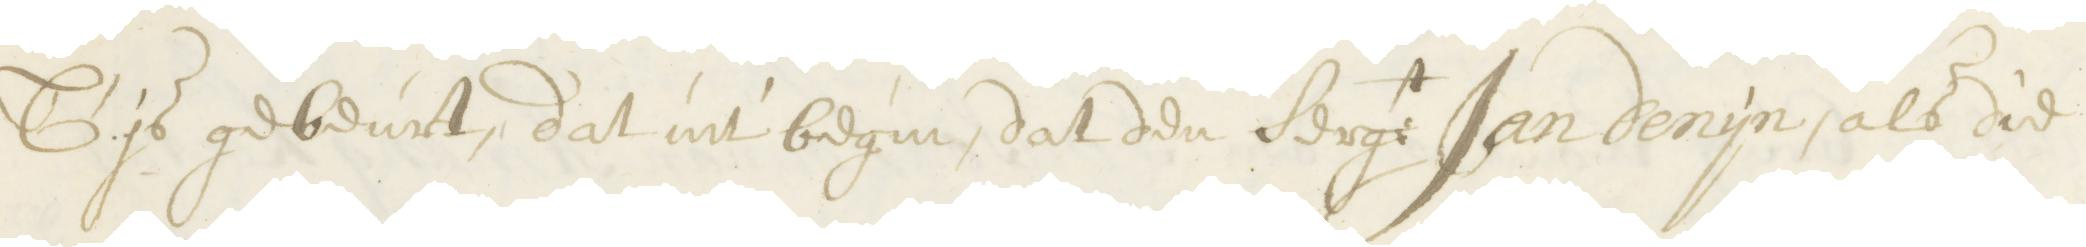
T'js gebeurt, dat int' begin, dat den serg:t Jan denijn, als die
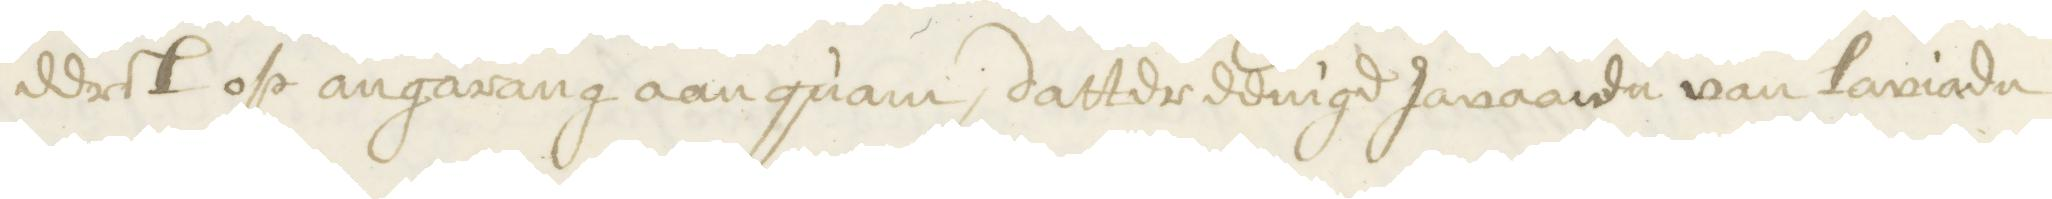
eerst op angarang aan quam, datter eenige Javaanen van laviaen
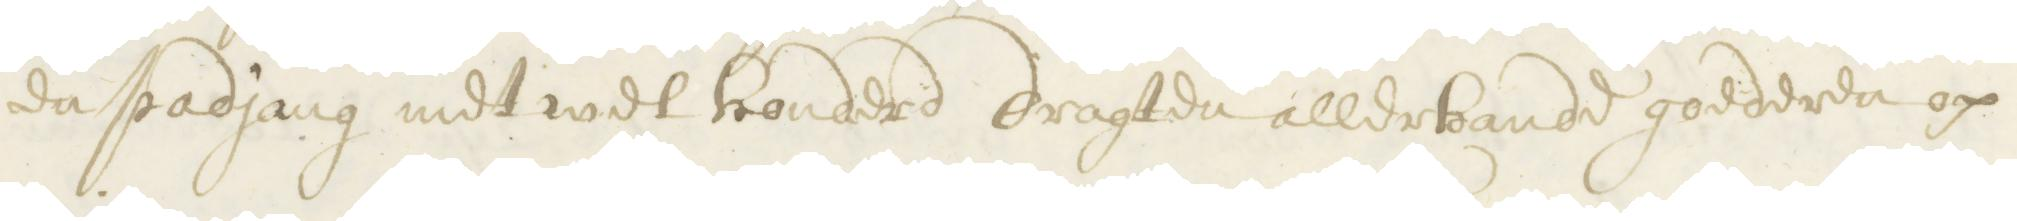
en padjang met wel honderd dragten allerhande goederen op
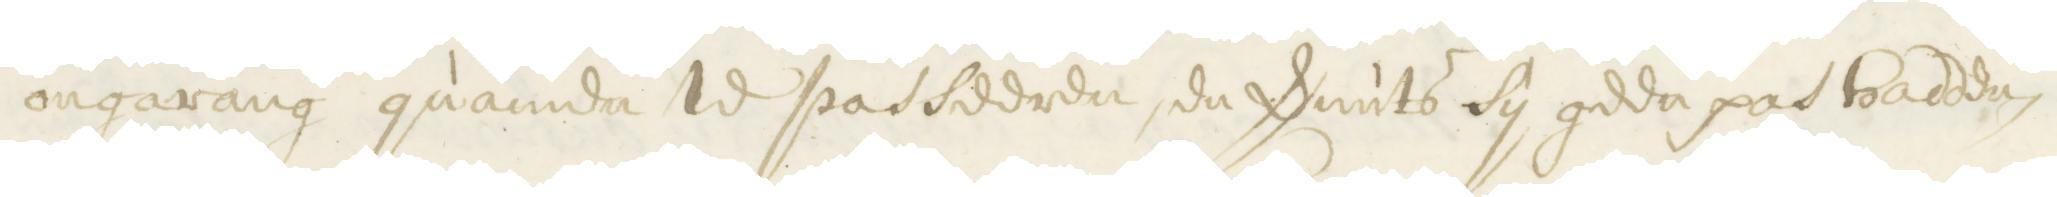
ongarang quamen te passeeren, en vermits sij geen pas hadden,
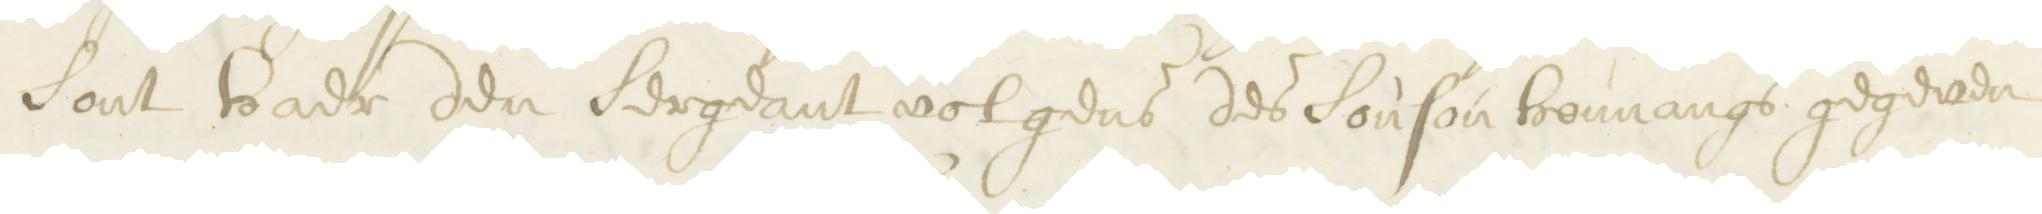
sont haer den sergeant volgens des sousou hounangs gegeven
